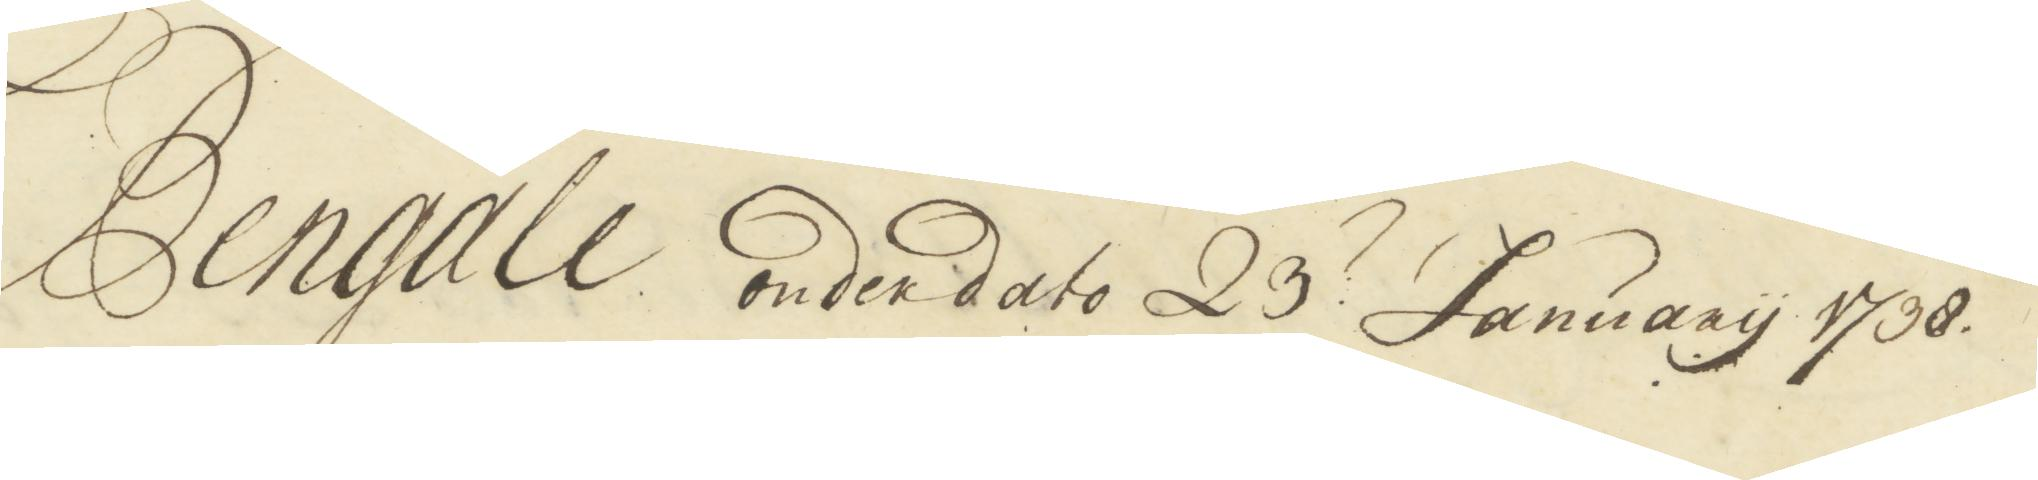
Bengale onder dato 23:' Januarij 1738.
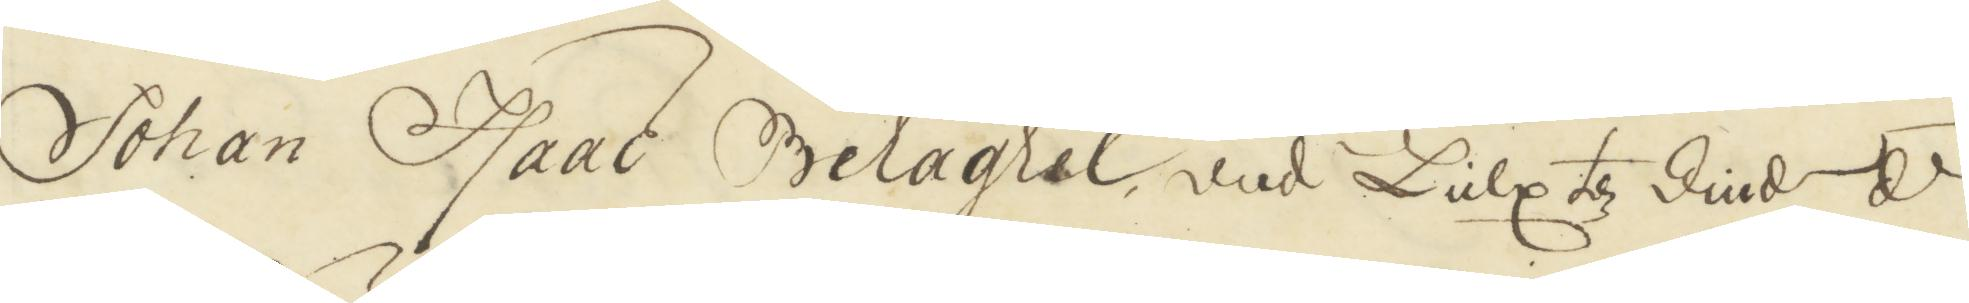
Johan Isaac Belaghel, end zulx ten Einde de
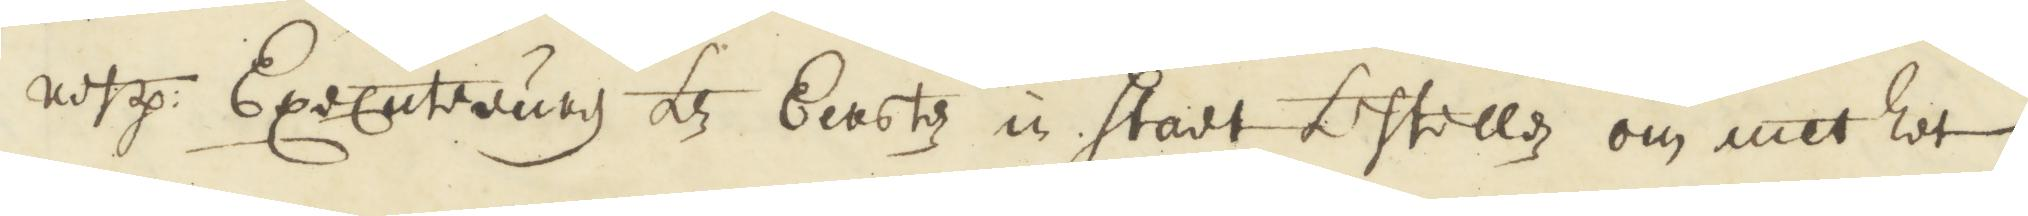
resp: Executeeuren ten Eersten in staet te stellen om met het
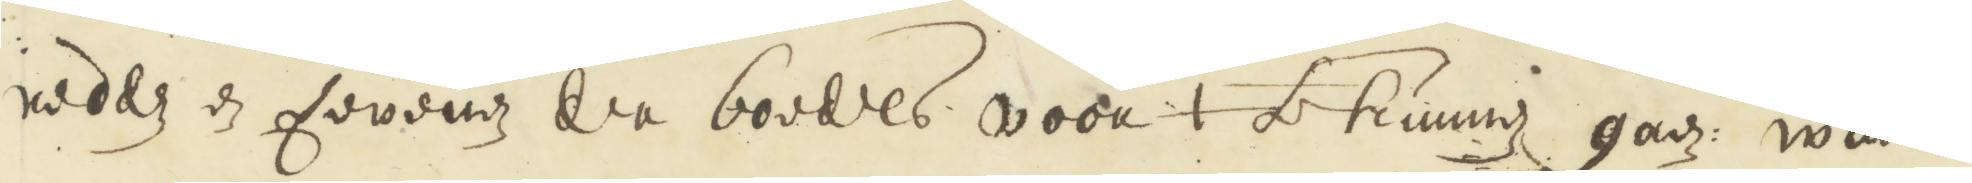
redden en verevenen der boedels voor 't te kunnen gaen: waer
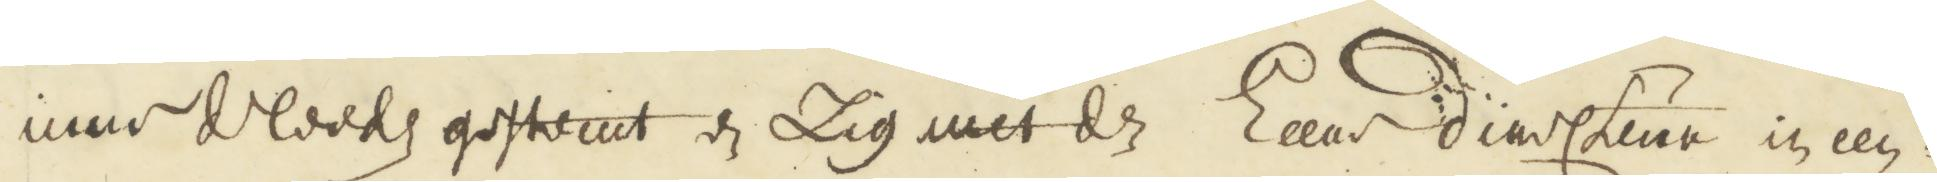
inne de leeden gestemt en zig met den heere directeur in een
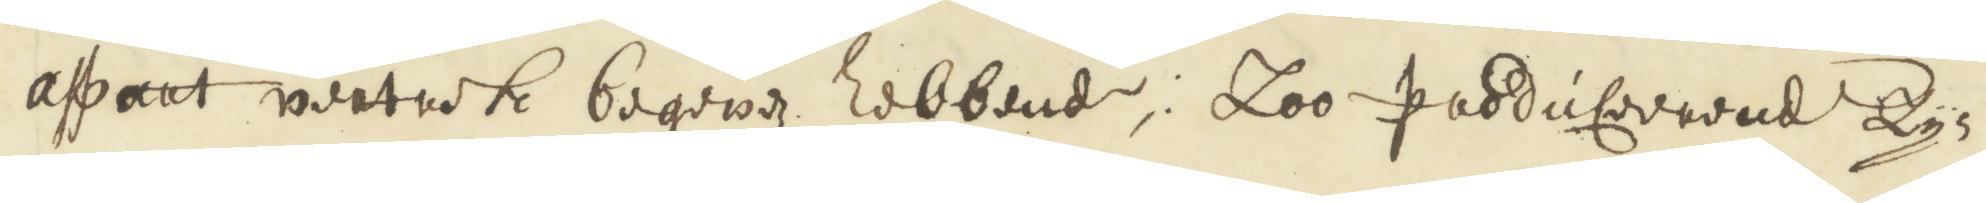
appart vertrek begeven hebbende: zoo produceerende zijn
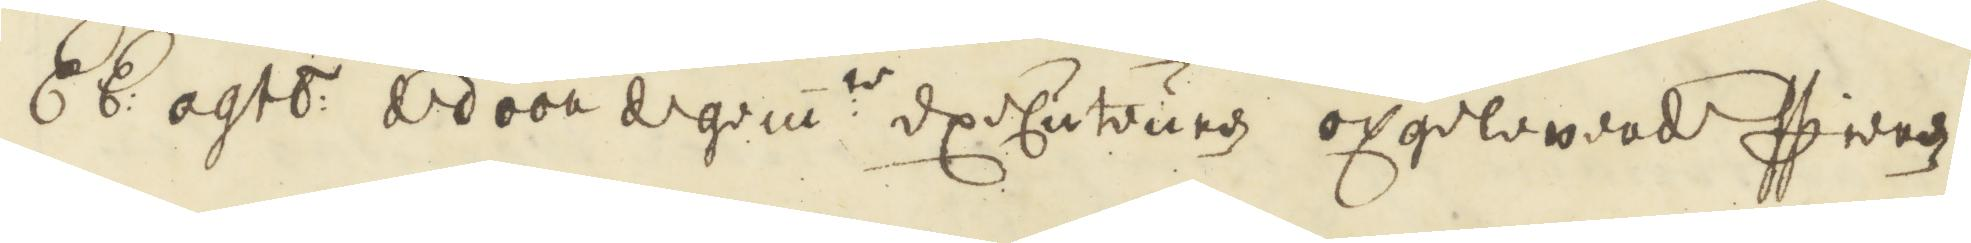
EE: agtb: de door de gem:te executeuren opgeleverde ppieren
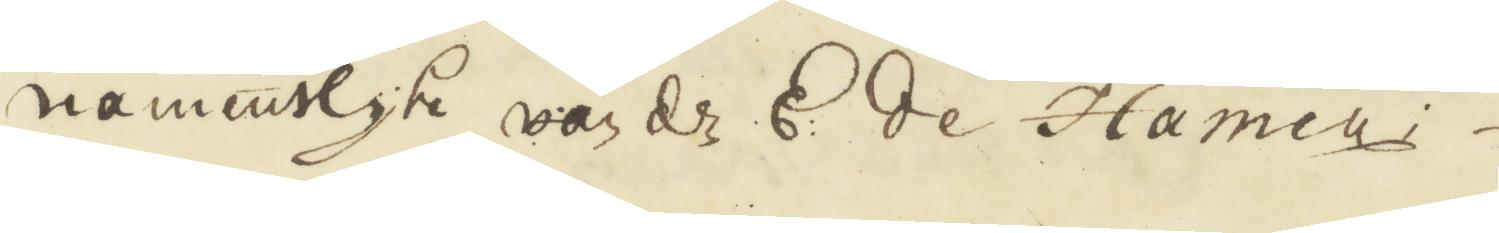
namentlijk van den E: de Hamer;
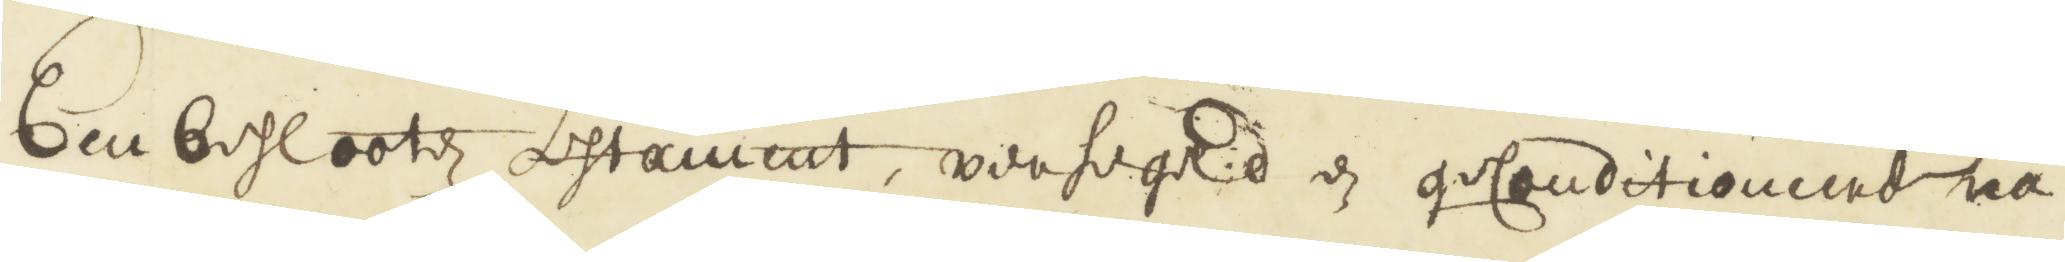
Een beslooten testament, versegeld en geconditioneerd na
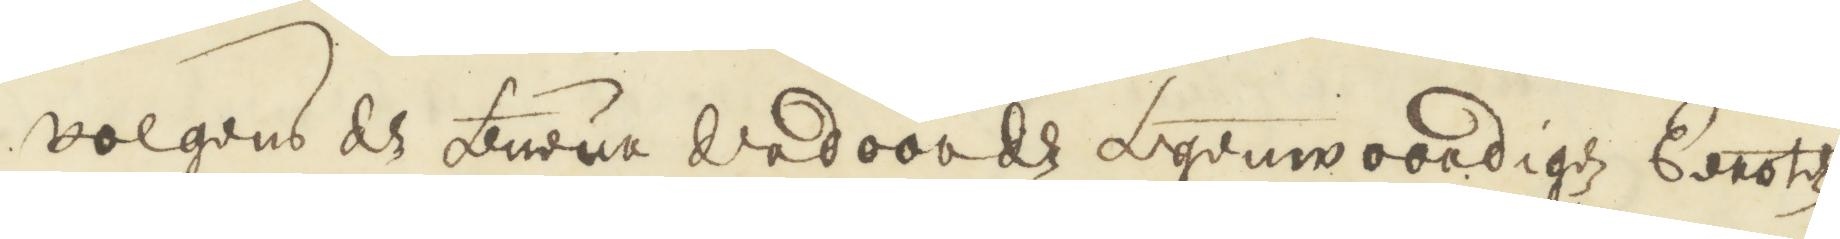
volgens den teneur der door den tegenwoordigen Eersten
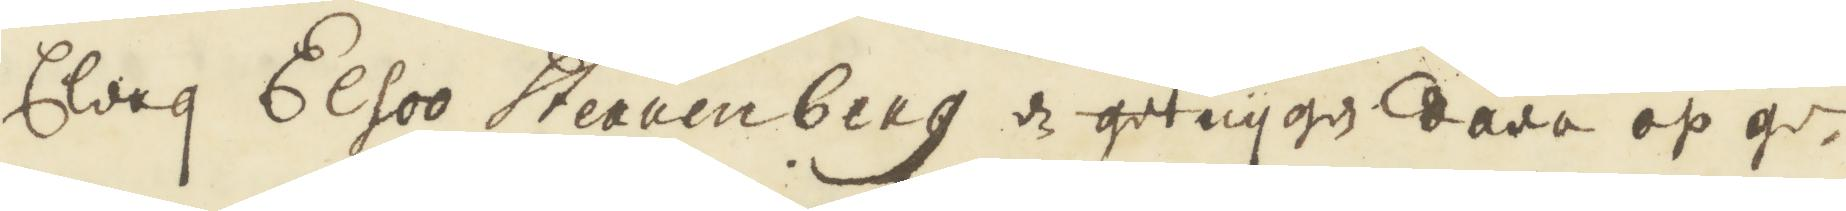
Clerq Elsoo sterrenberg en getuijgen daer op ge„
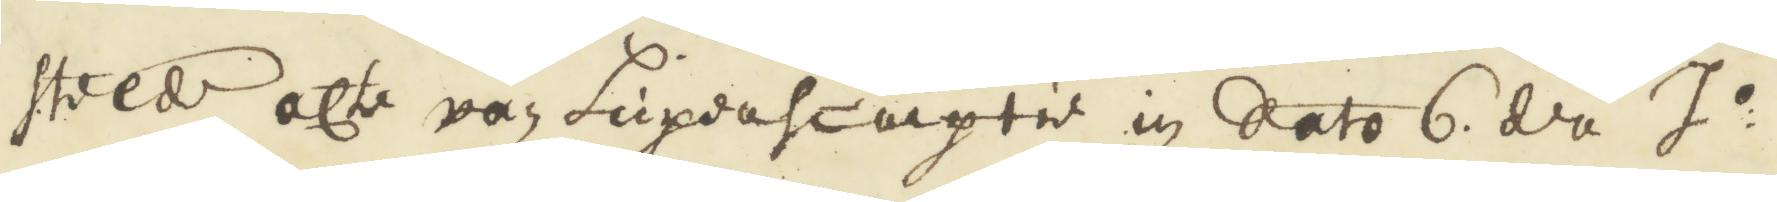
stelde acte van superscriptie in dato 6. der J:o
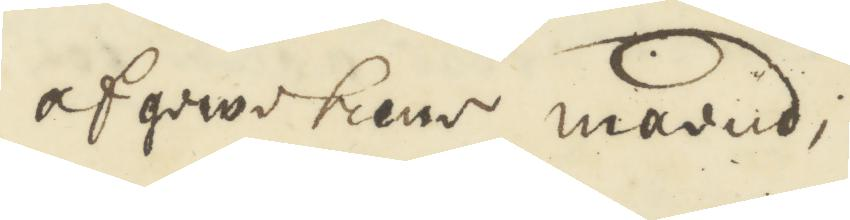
afgewekene maend;
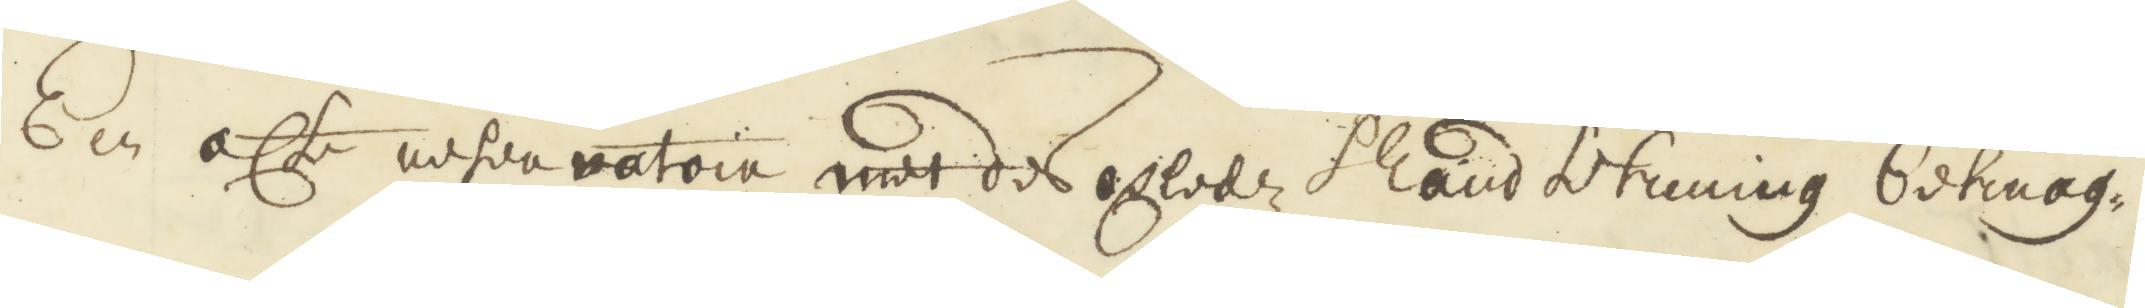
Een ofte reservatoir met des overleden s hand tekening bekrag„
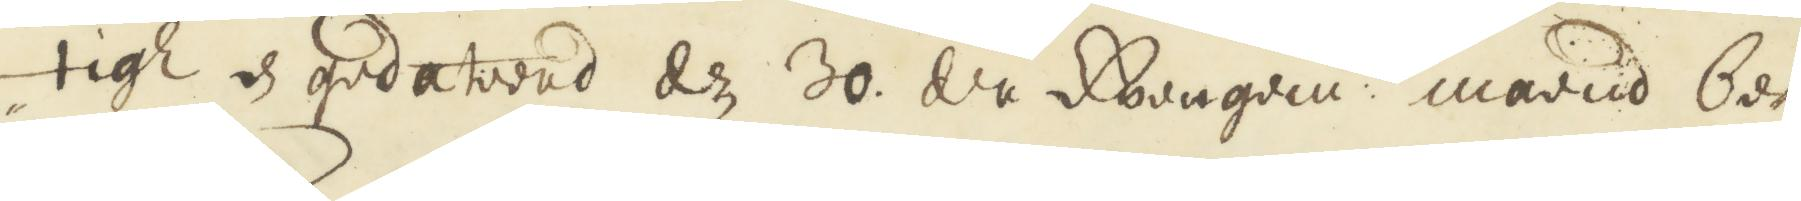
„tigh en gedateerd den 30. der Evengem:te maend be
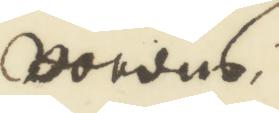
vorens;
